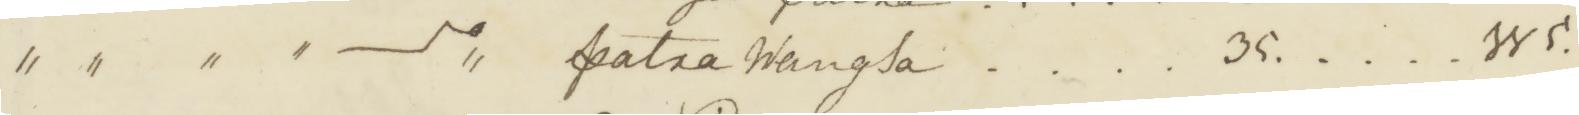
„ „ „ „ _„o patra wangsa . . . . 35. . . . . 115.
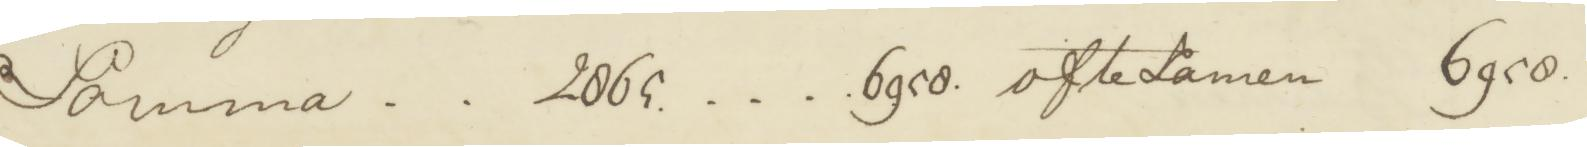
Somma . . 2865. . . . . 6958. oftezamen 6958.
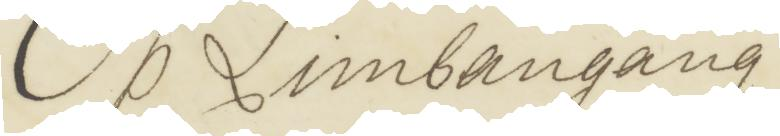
Op Limbangang
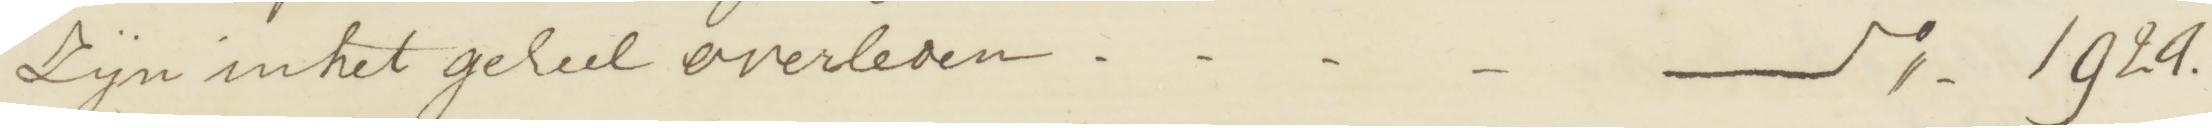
Zijn in het geheel overleden . . . . _„o . 1924.
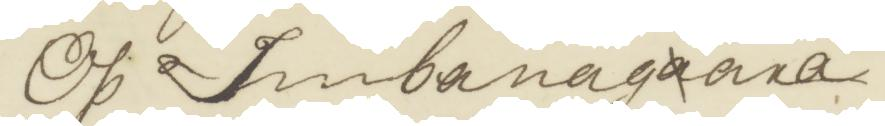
Op Jmbanagaara
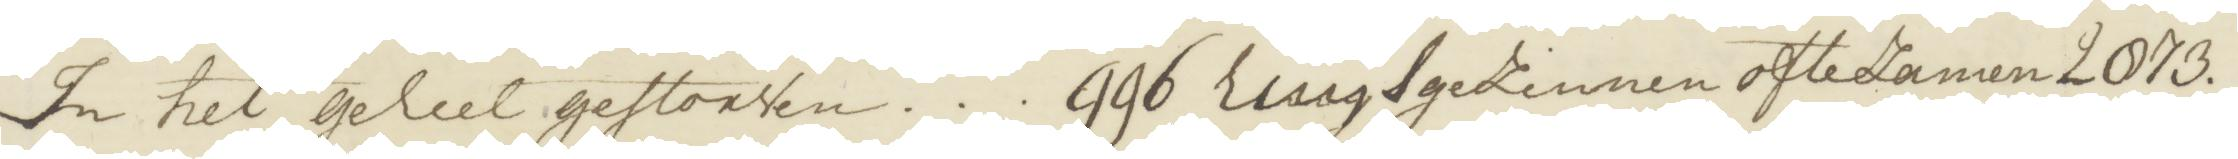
Jn het geheel gestorven . . . 996 huijsgezinnen oftezamen 2873.
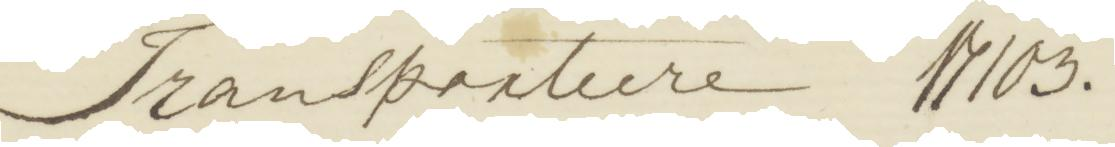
Transporteere 17103.
